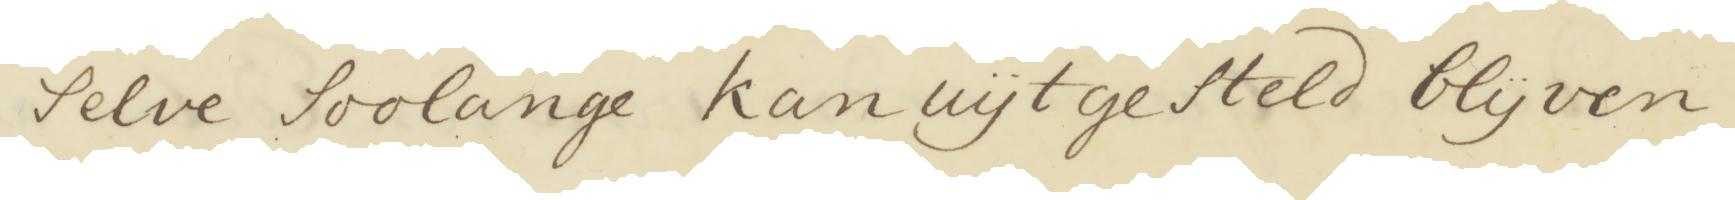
selve soolange kan uijtgesteld blijven
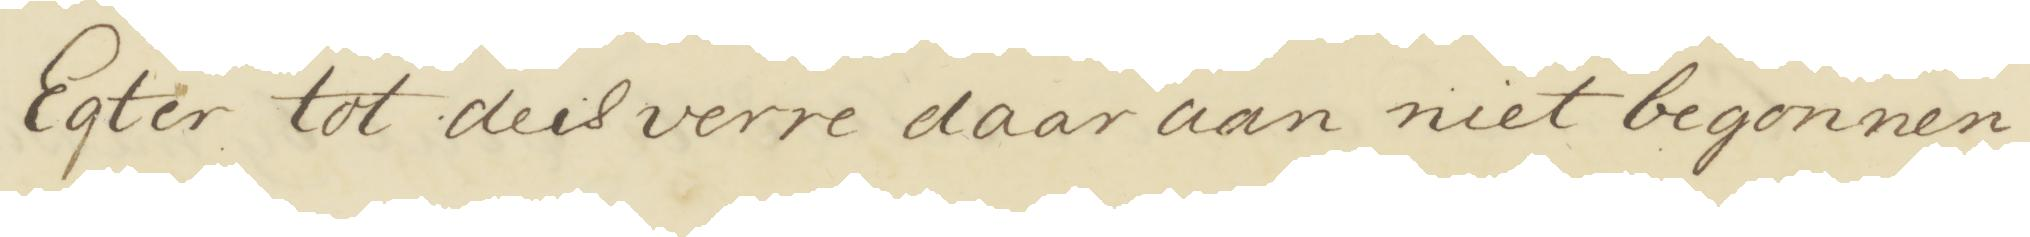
Egter tot dus verre daar aan niet begonnen
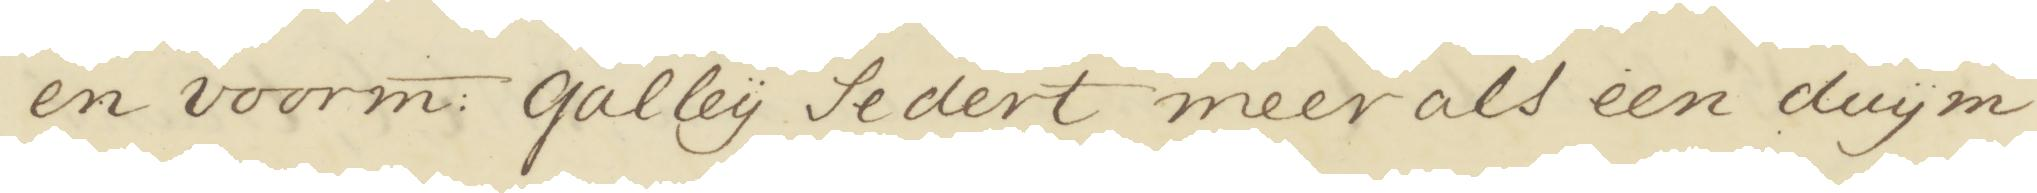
en voorm: galleij sedert meer als een duijm
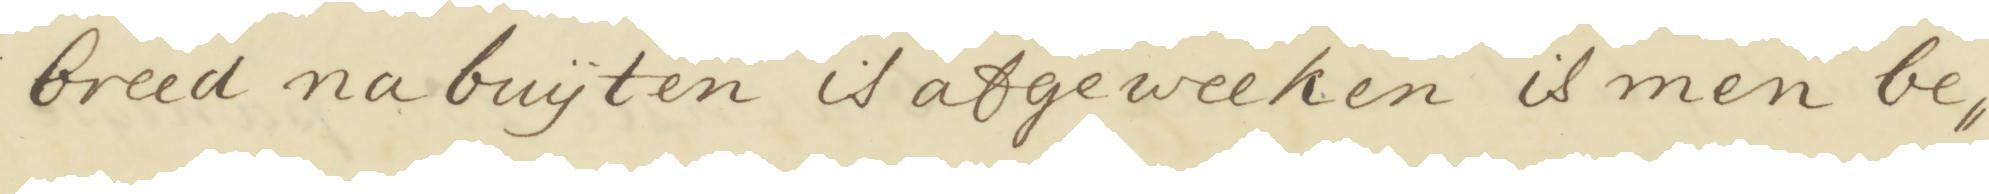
breed na buijten is afgeweeken is men be„
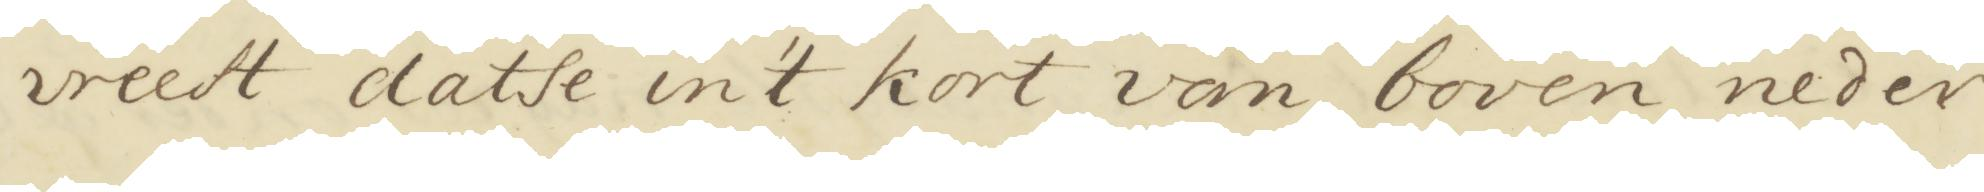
vreest datse in ’t kort van boven neder
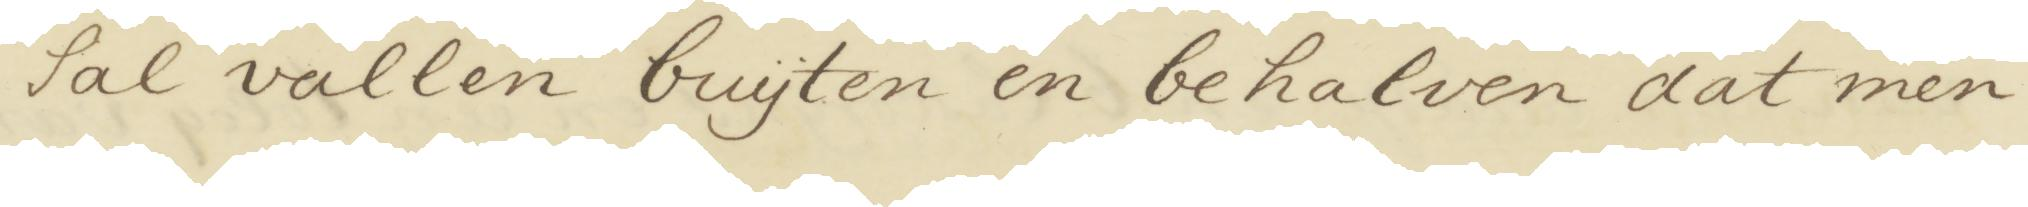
sal vallen buijten en behalven dat men
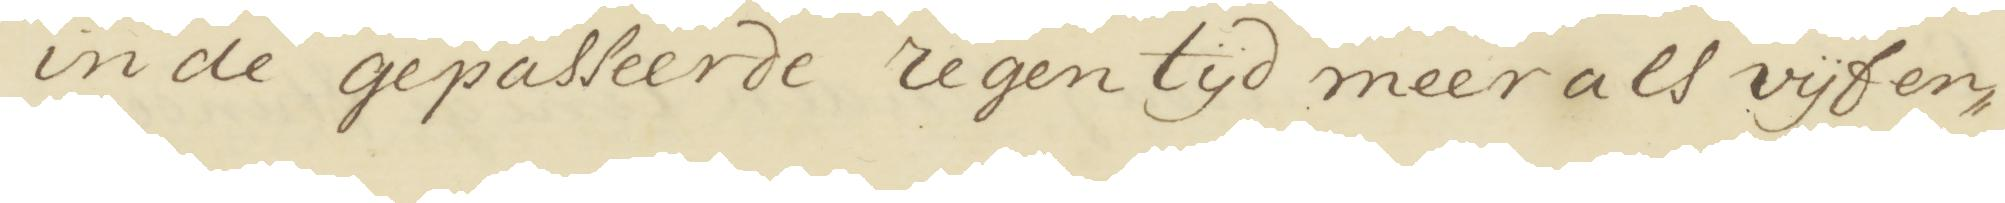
in de gepasseerde regen tijd meer als vijf en„
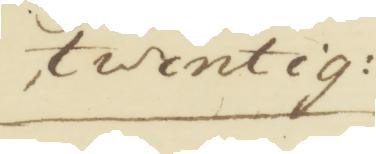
„twintig:
